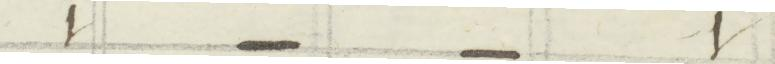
1 — — 1
